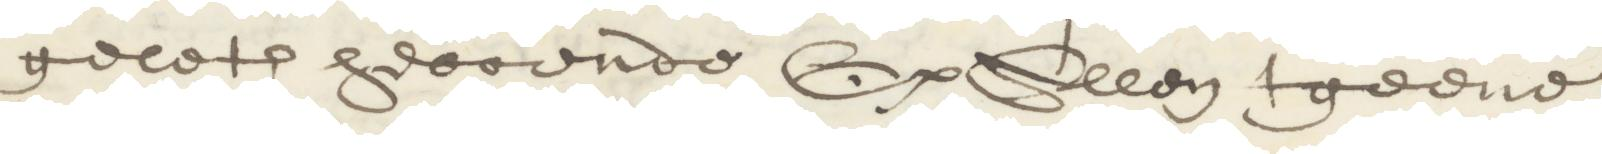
geleth hebbende Op Allen tgeene
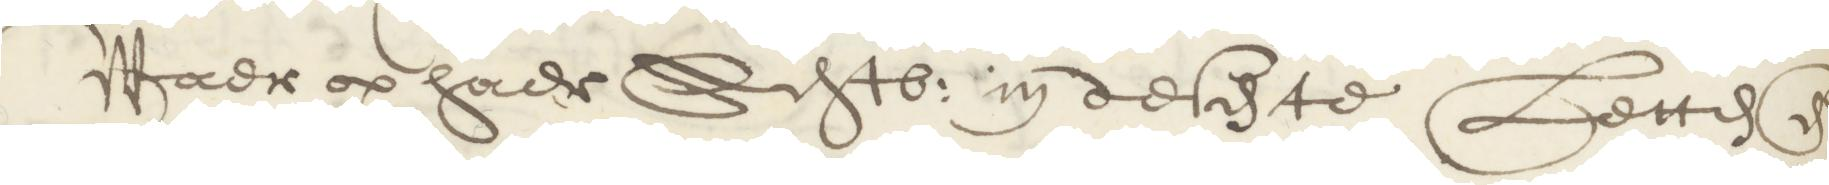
Waer op haer Achtb: in desen te Letten ende
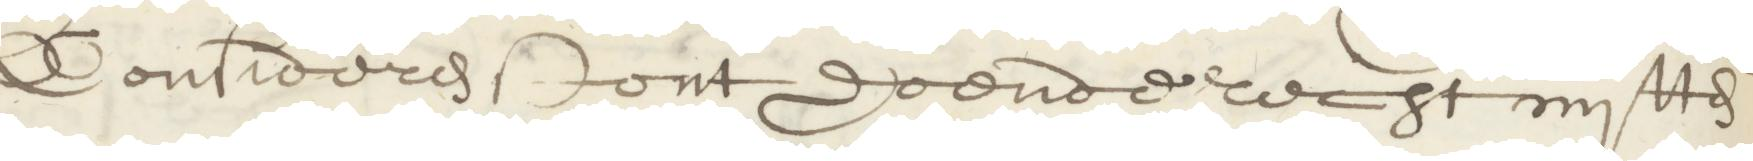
Consideren stont doende recht uijtten
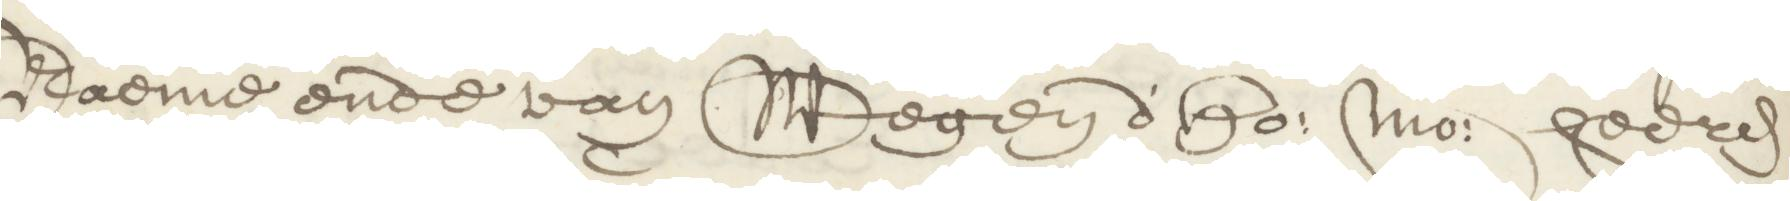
Naeme ende van Wegen d’ Ho: mo: heeren
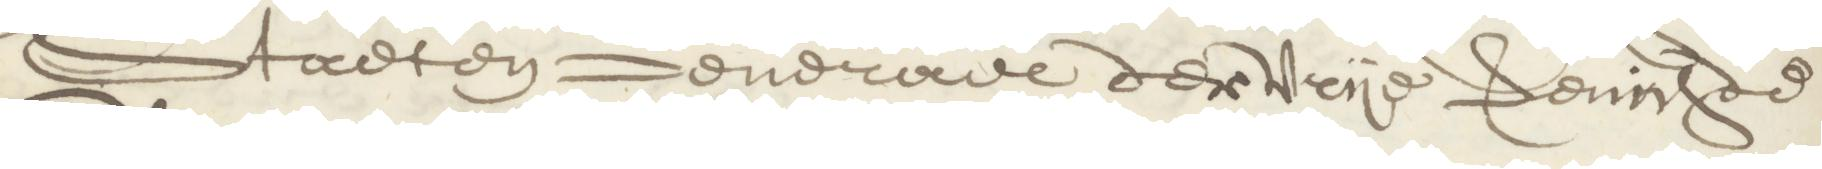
Staeten Generael der vrije verenigde
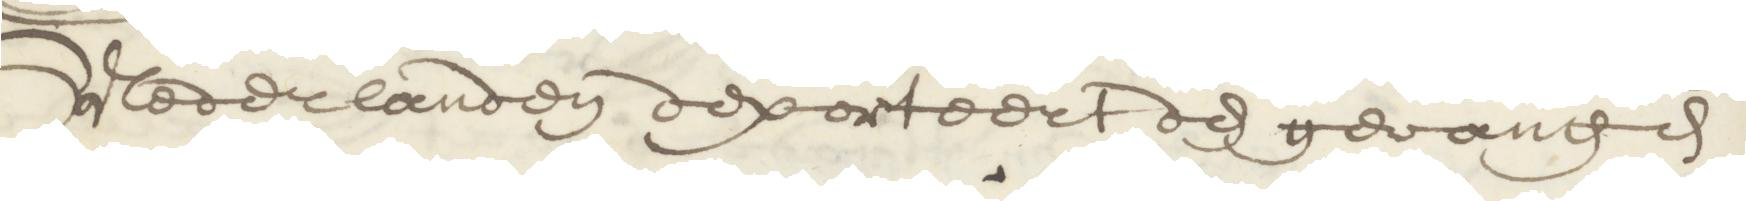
Nederlanden deporteert den gevangen
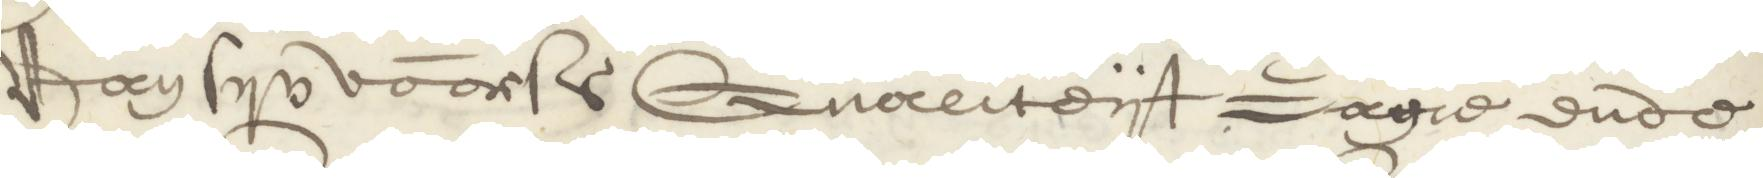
Van syn voorsz Qualiteijt Gagie ende
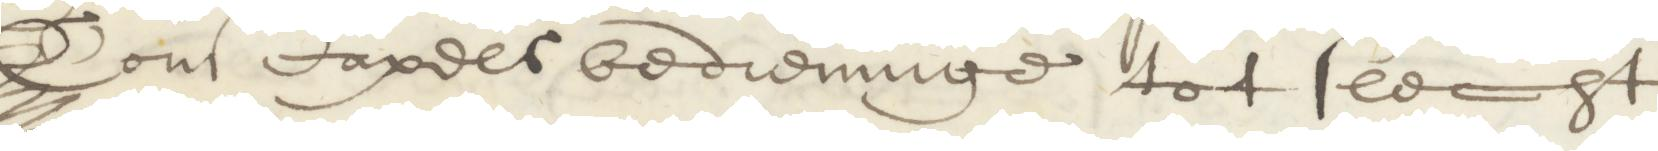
Constapels bedieninge tot slecht
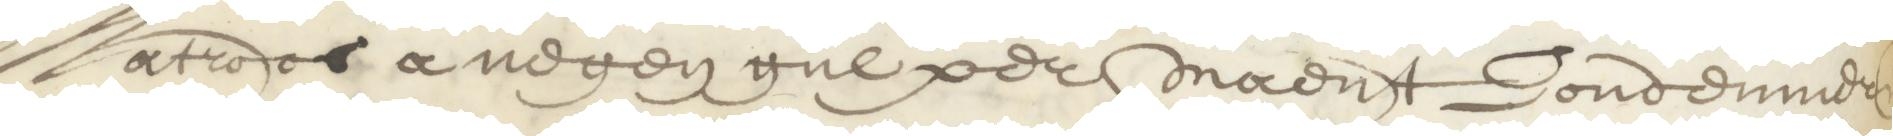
Matroos a negen gul per maent Condemnerende
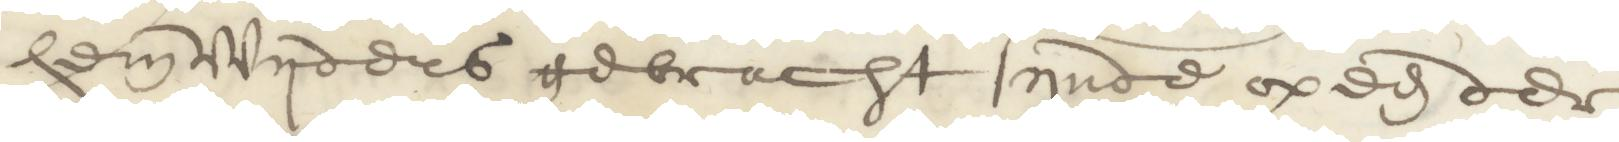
hem Wyders gebracht synde op een der
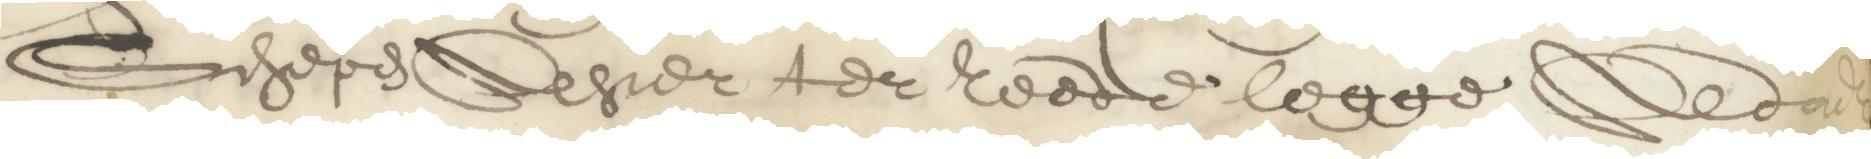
Schepen Alhier ter reede legge Aldaer
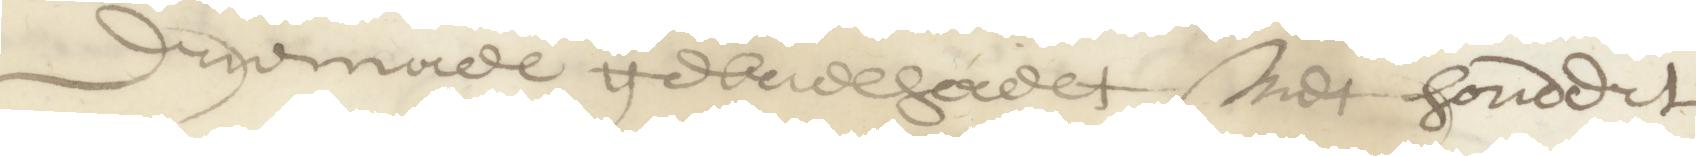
Driemael gekielhaelt met hondert
